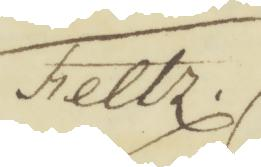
Feltz.
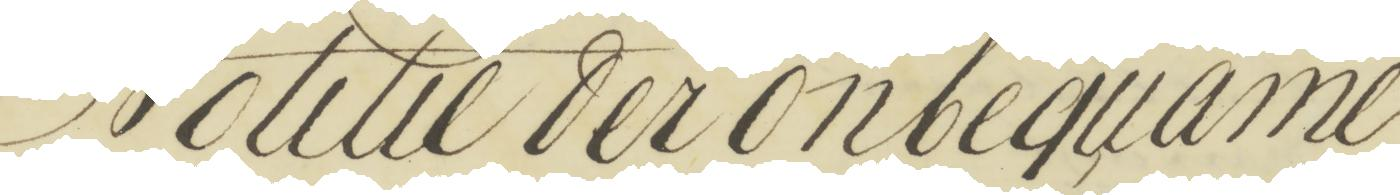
Notitie der onbequame
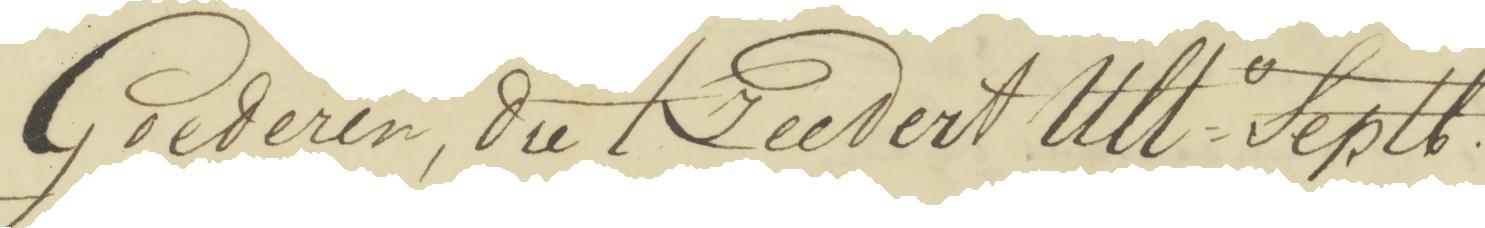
Goederen, die 't zeedert Ult:o septb:
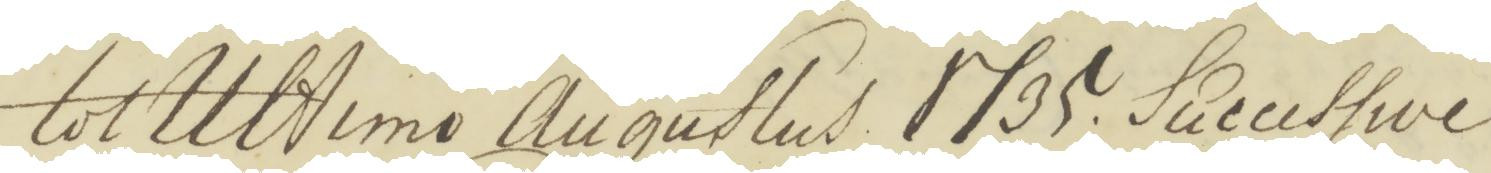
tot Ultimo Augustus 1735. Successive
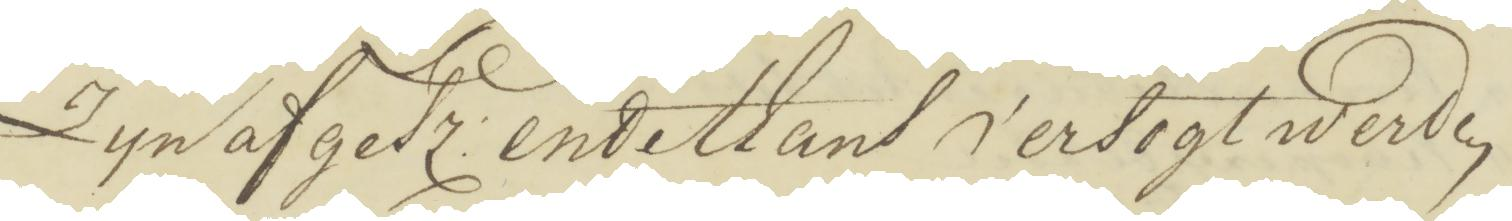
zijn afgesz: ende thans versogt werden
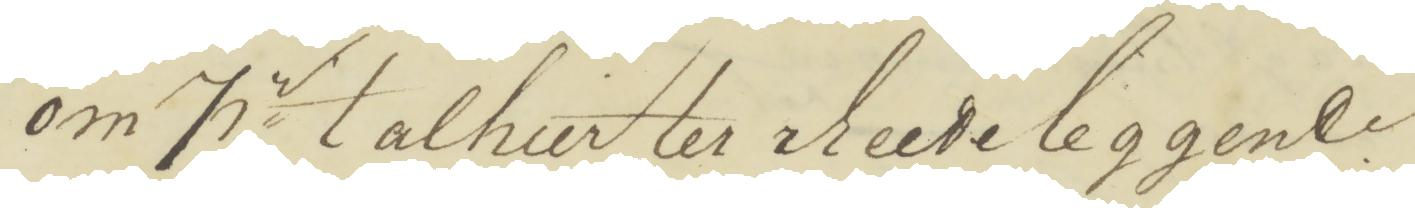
om p:r ’t alhier ter rheede leggende
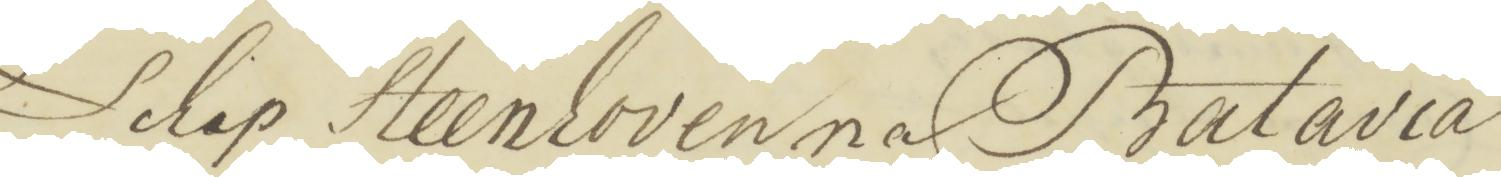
schip steenhoven na Batavia
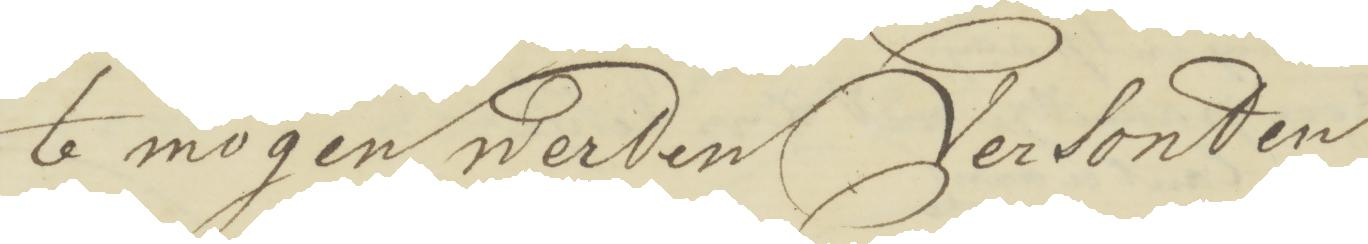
’t mogen werden Versonden,
